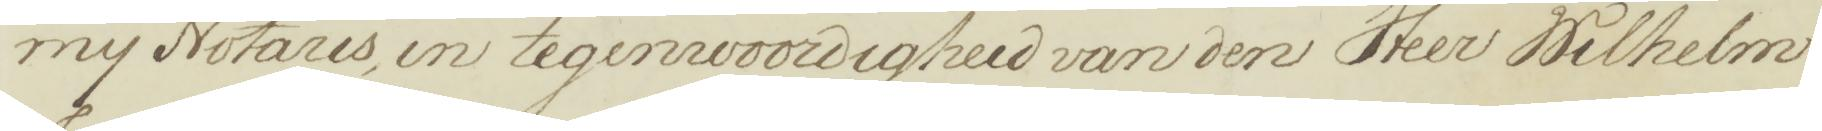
my Notaris, in tegenwoordigheid van den Heer Wilhelm
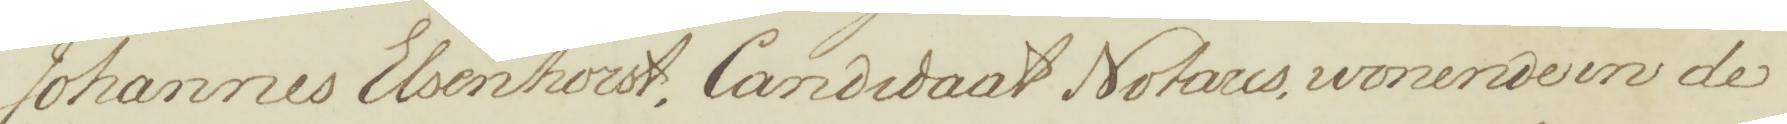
Johannes Elsenhorst, Candidaat Notaris, wonende in de
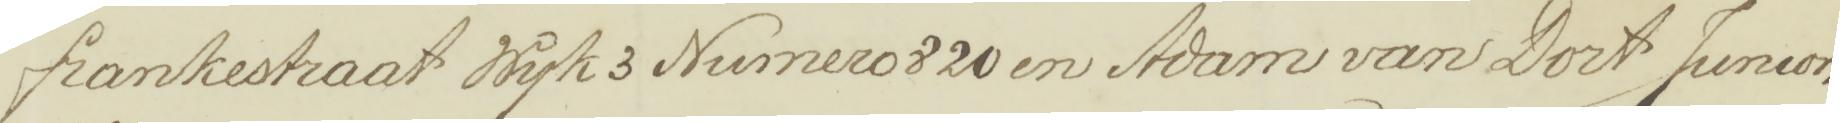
frankestraat Wyk 3 Numero 820 en Adam van Dort Junior,
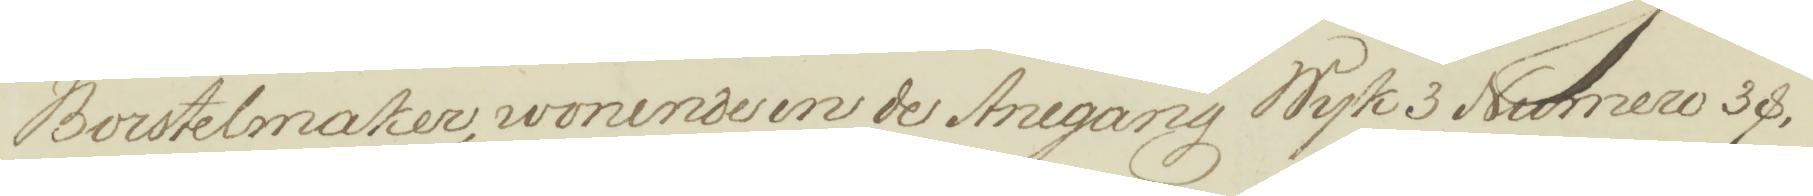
Borstelmaker, wonende in de Anegang Wyk 3 Numero 38,
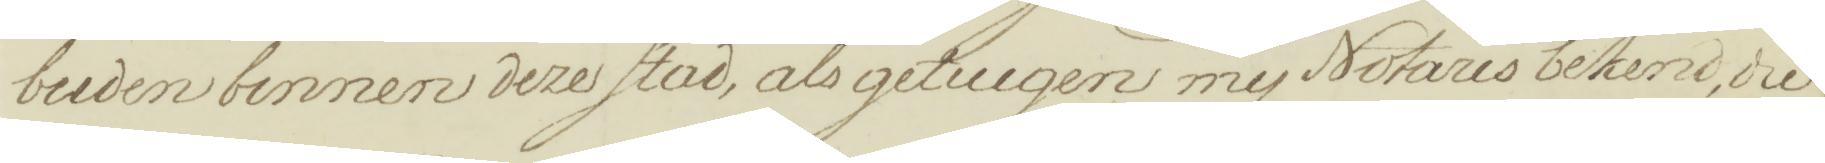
beiden binnen deze stad, als getuigen my Notaris bekend, die
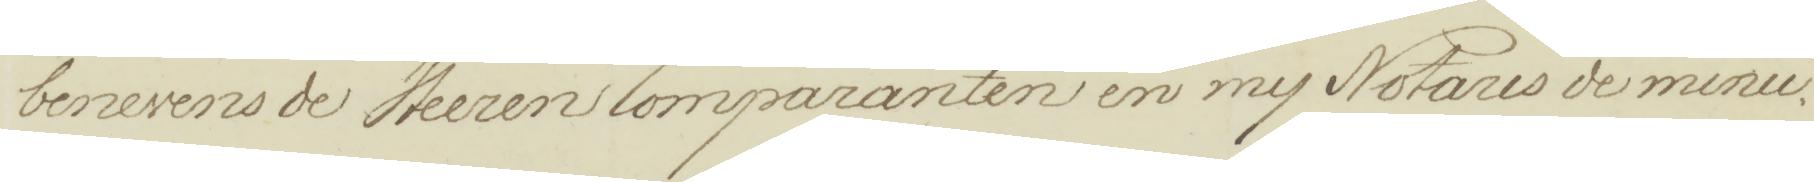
benevens de Heeren Comparanten en my Notaris de minu„
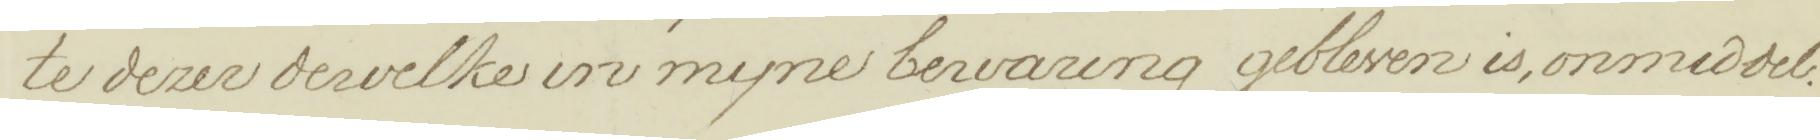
te dezer dewelke in myne bewaring gebleven is, onmiddel.
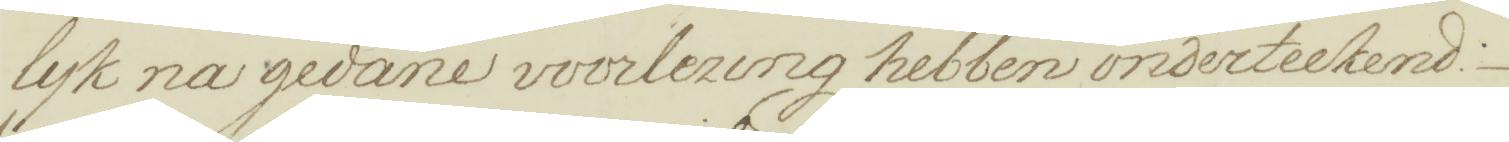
lyk na gedane voorlezing hebben onderteekend:—
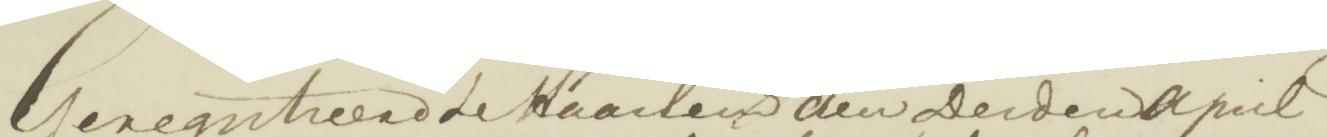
Geregistreerd te Haarlem den Derden april
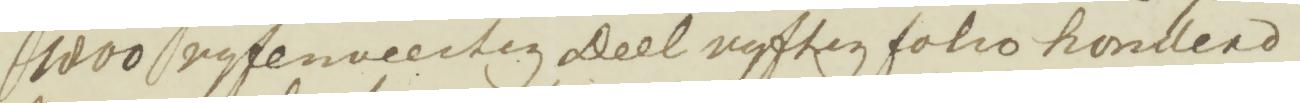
1800 vyfenveertig Deel vyftig folio honderd
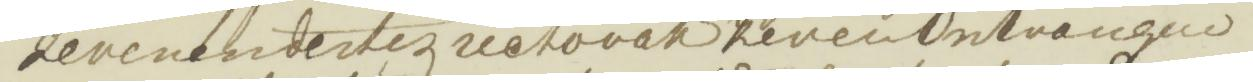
zevenendertig recto vak zeven Ontvangen
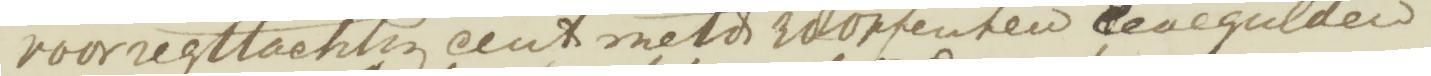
voor regt tachtig cent met de 38 opcenten Eene gulden
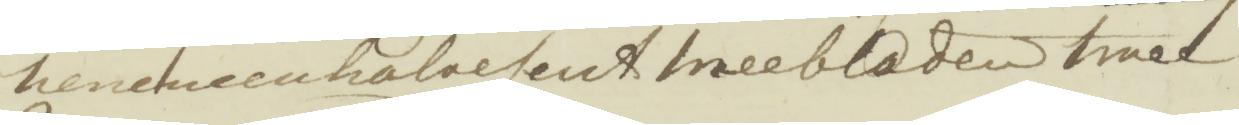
tien en een halve Cent twee bladen twee
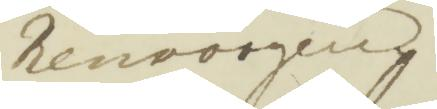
Renvooyen.
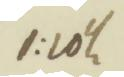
1:10½
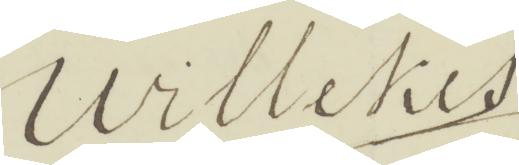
Willekes
